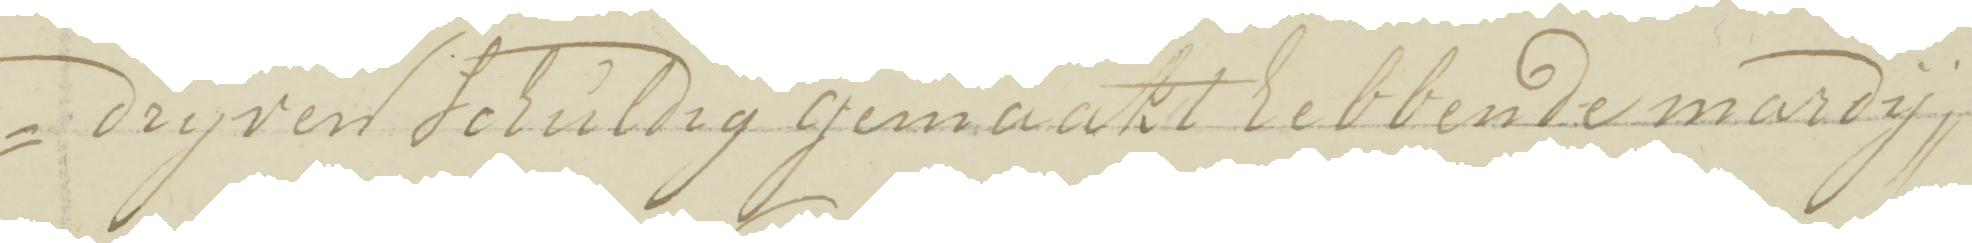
= drijven schuldig gemaakt hebbende mardij„
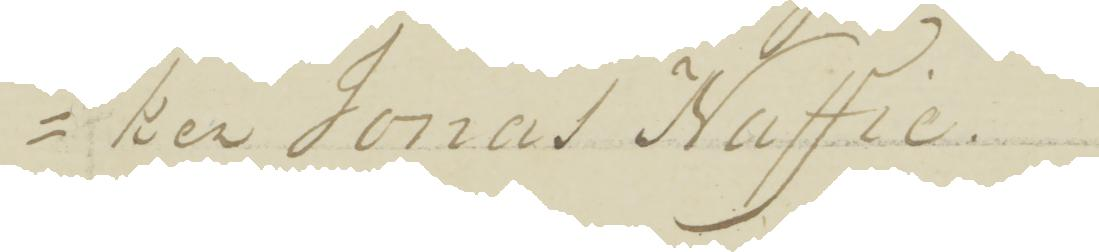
= ker Ionas Naffie.
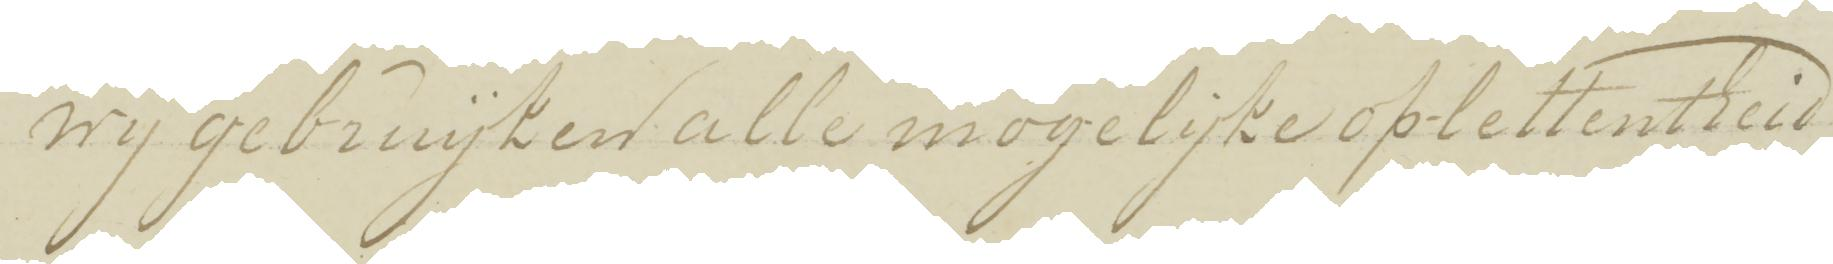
wij gebruijken alle mogelijke oplettentheid
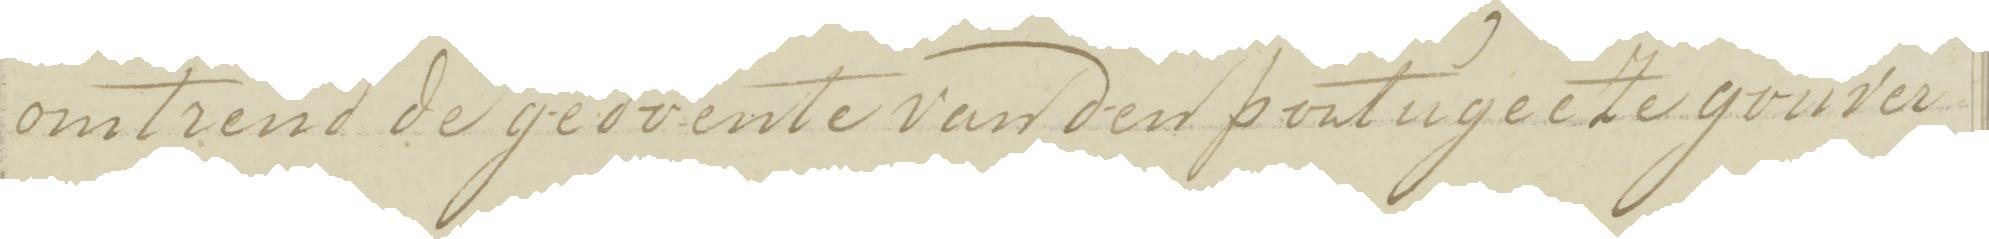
omtrend de gedoente van den portugeeze gouver„
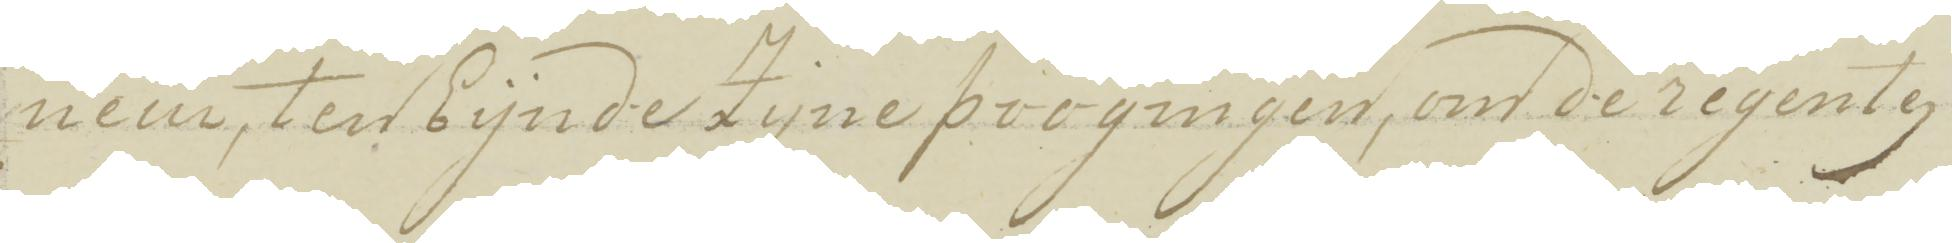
neur, ten Eijnde zijne poogingen, om de regenten
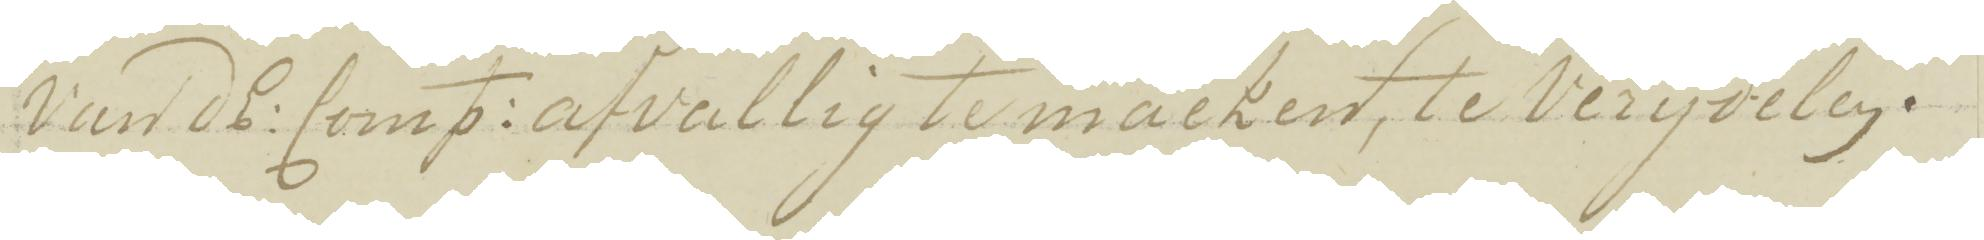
van d'E: Comp: afvallig te maeken, te verijdelen.
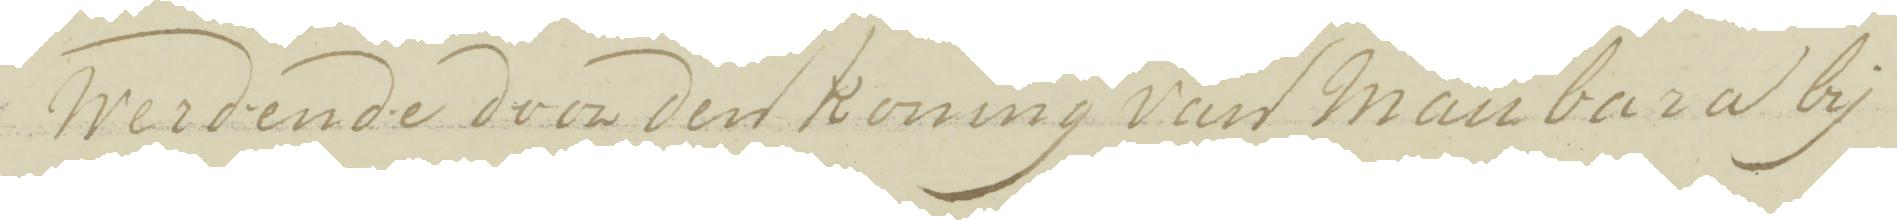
werdende door den Koning van Manbara bij
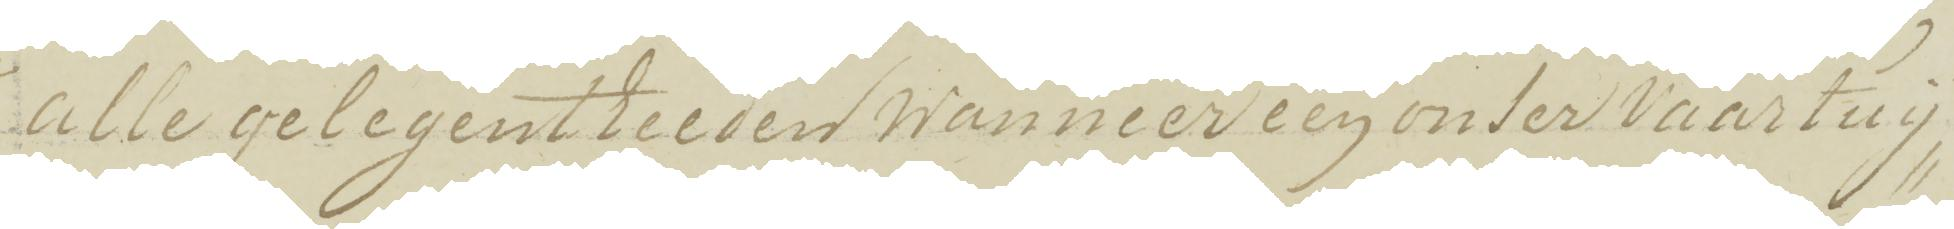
alle gelegentheeden wanneer een onser vaartuij„
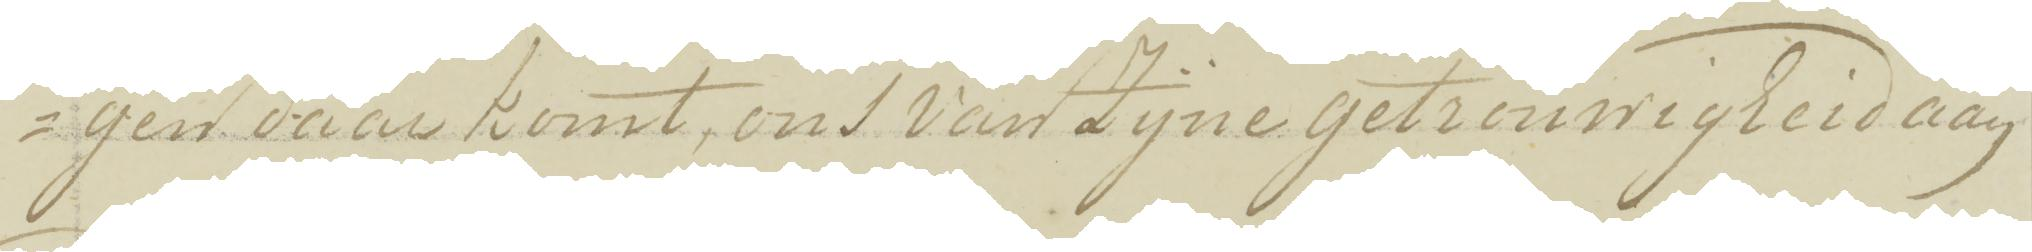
= gen daar komt, ons van zijne getrouwigheid aan
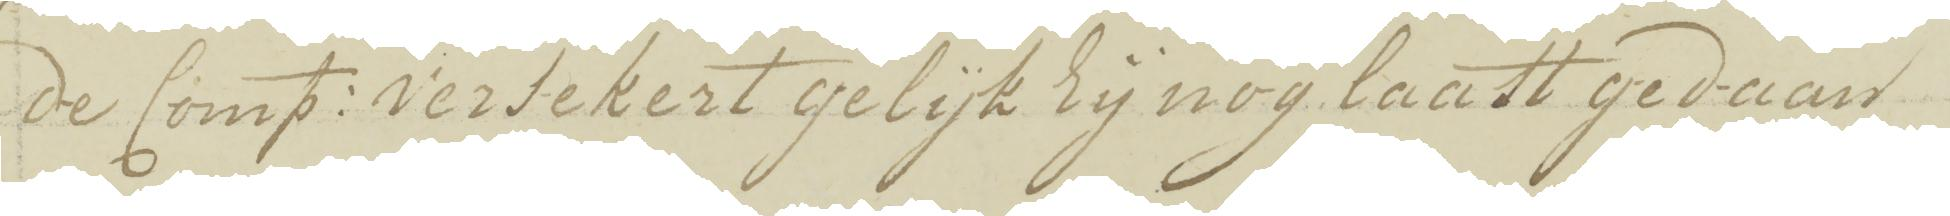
de Comp: versekert gelijk hij nog laast gedaan
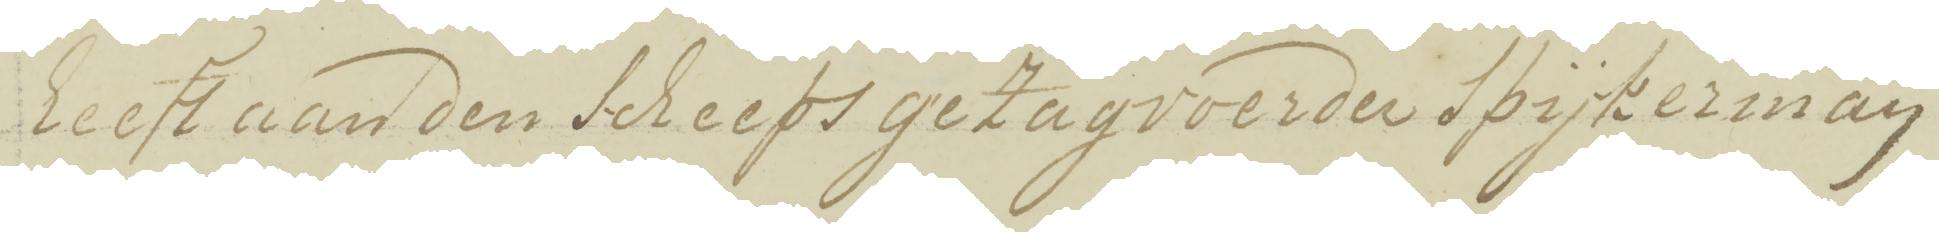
heeft aan den scheeps gezagvoerder spijkerman
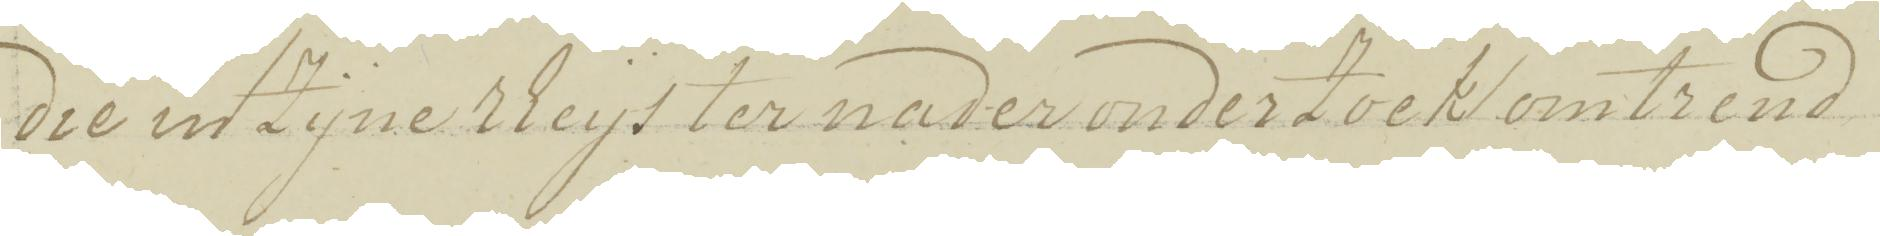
die in zijne rheijs ter nader onderzoek omtrend
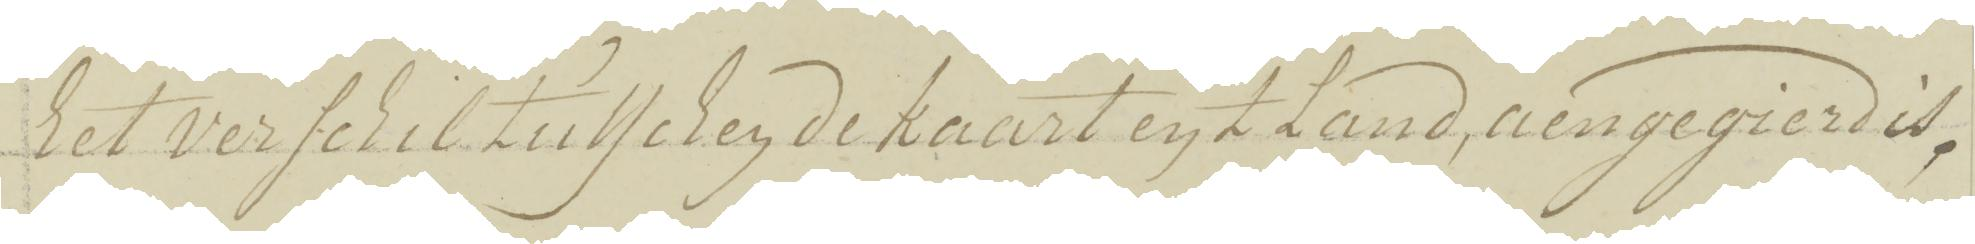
het verschil tusschen de kaart en 't land, aengegierd is,
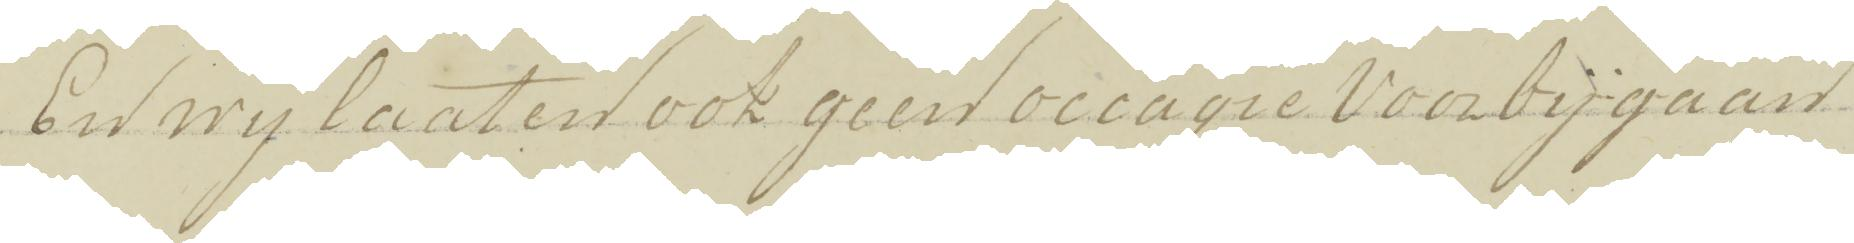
En wij laaten ook geen occagie voorbijgaan
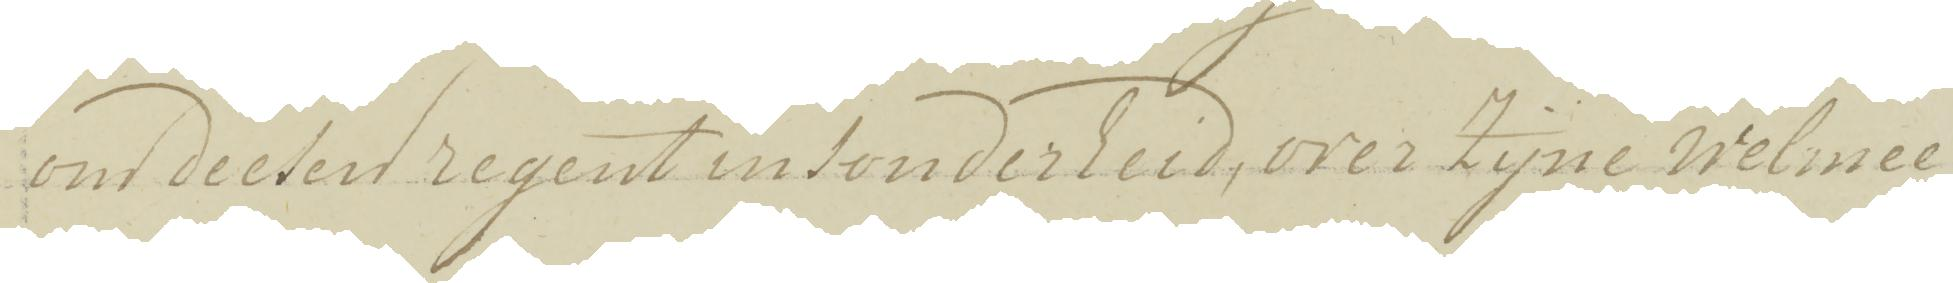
om deesen regent insonderheid, over zijne welmee
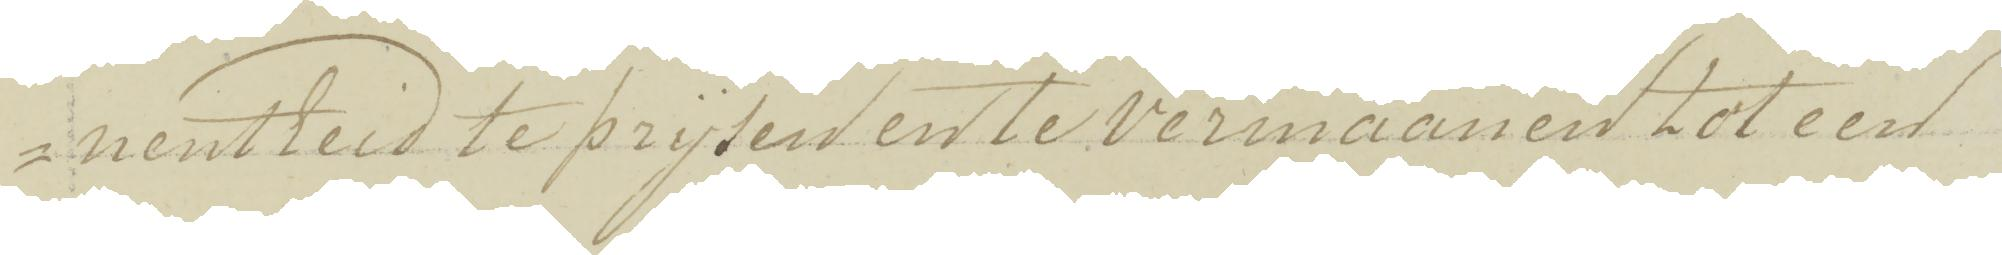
= nentheid te prijsen en te vermaanen tot een
